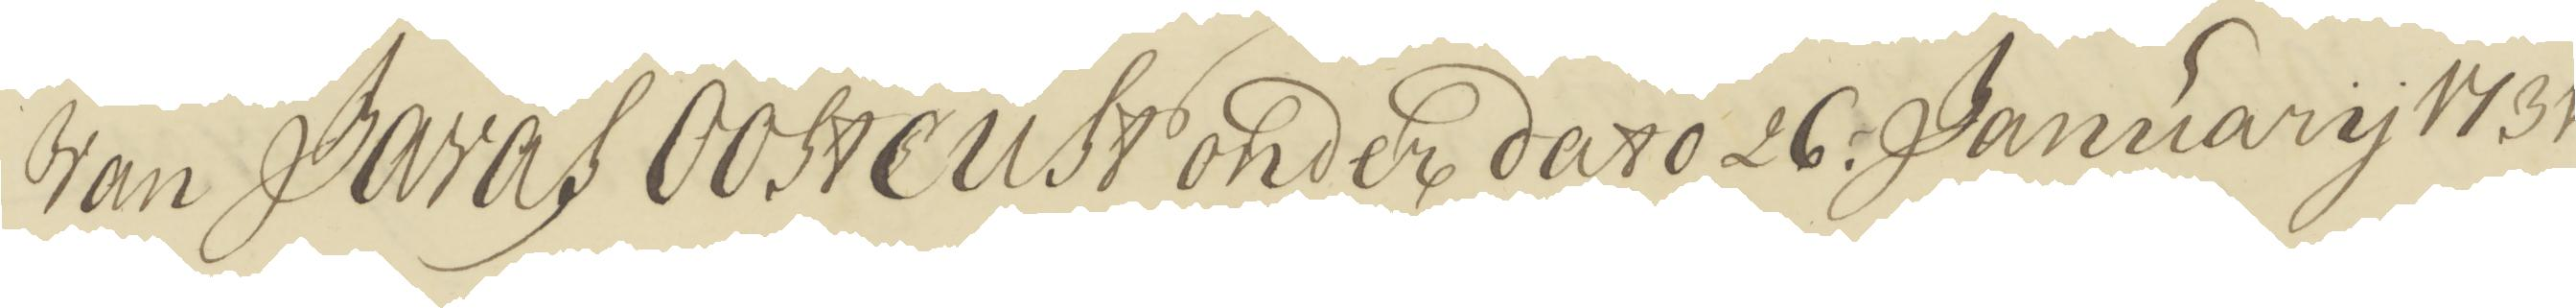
Van Javâs Oostcust onder dato 26.' Januarij 1731
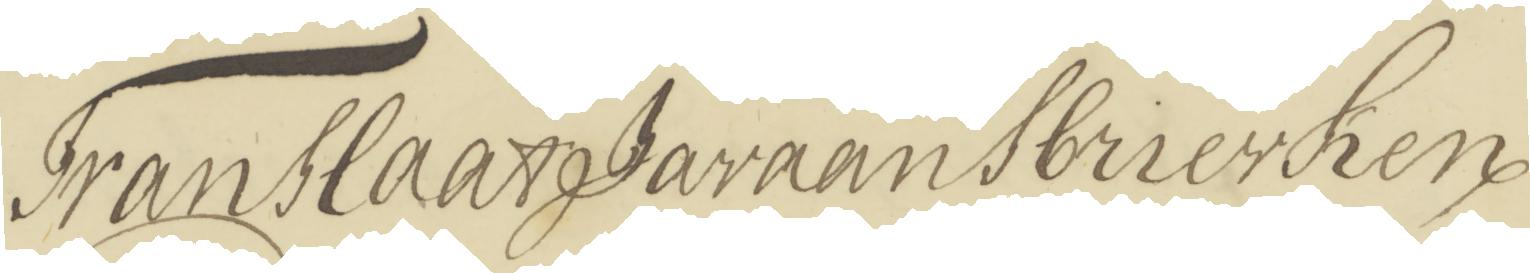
Translaat Javaans brievken
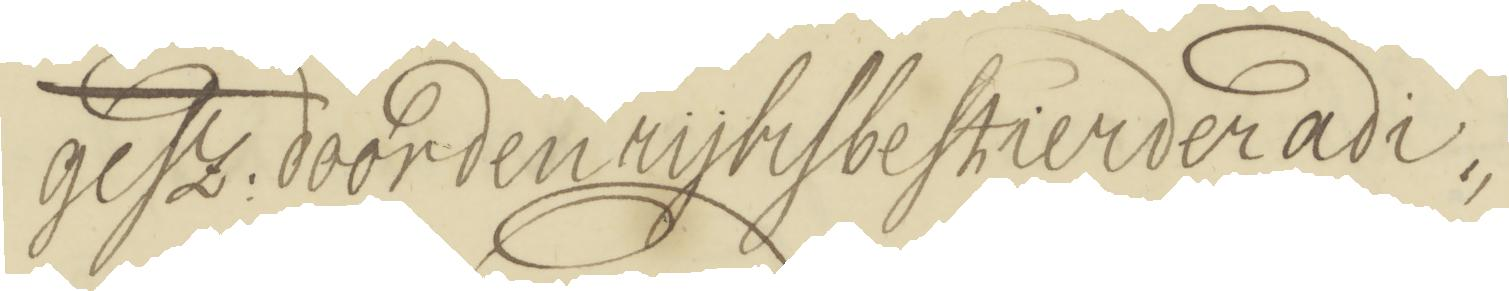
gesz: door den rijksbestierder adi„
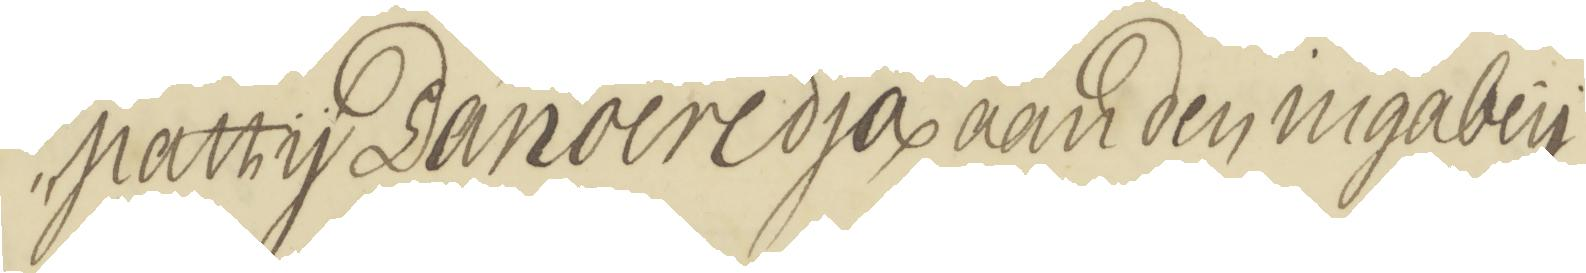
„pattij Danoeredja aan den ingabeij
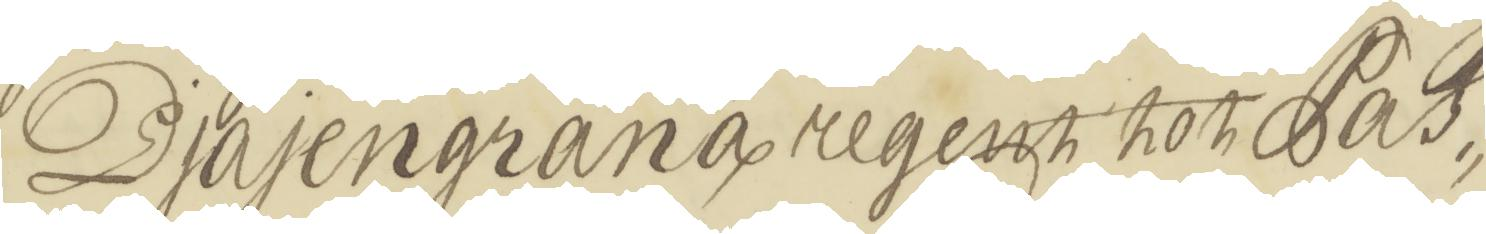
Djajengrana regent tot Pas„
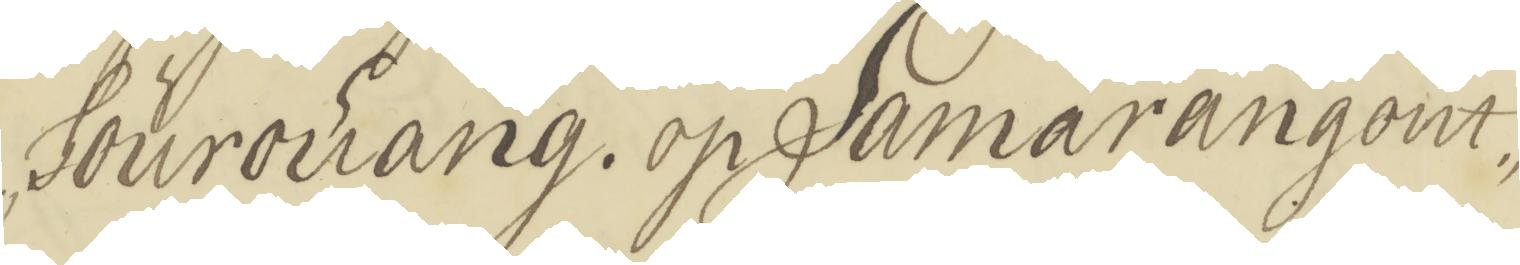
„sourouang. op Samarang ont
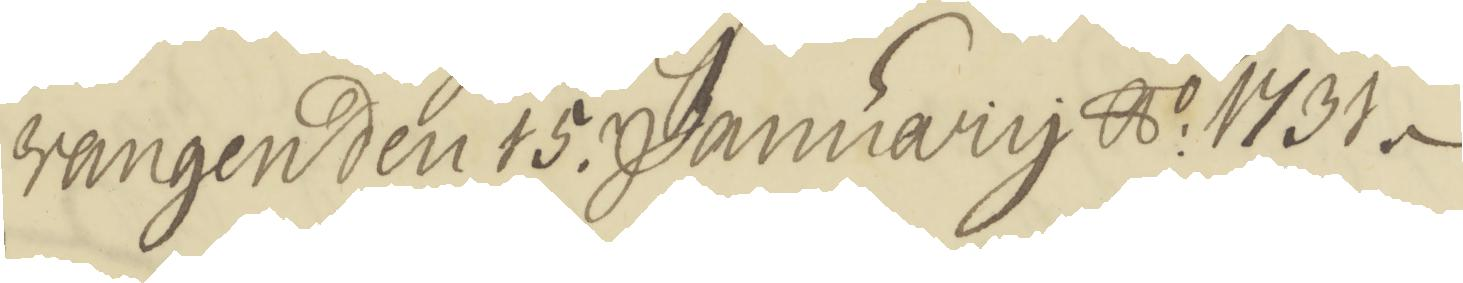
vangen den 15. Januarij A:o 1731. _
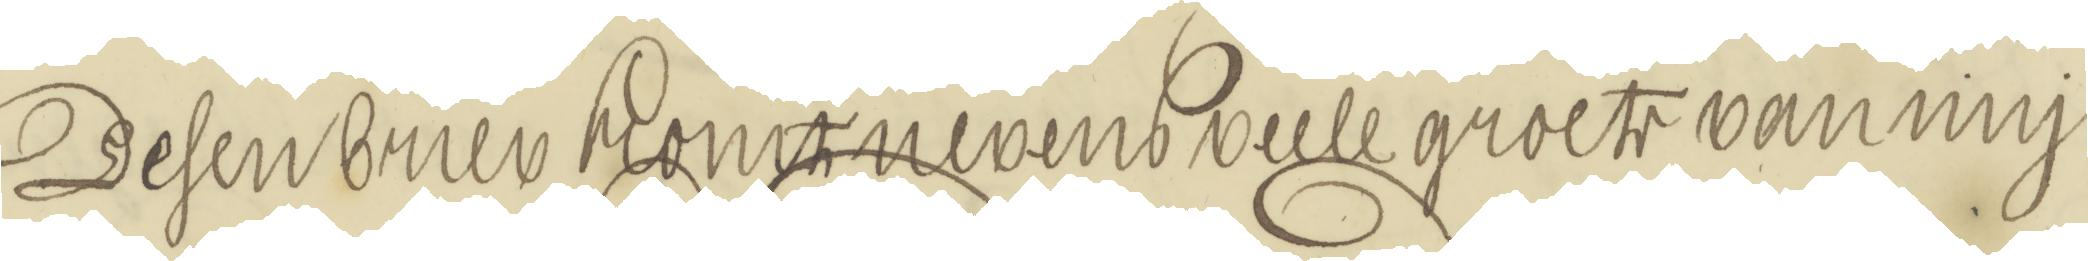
Desen briev komt nevens veele groete van mij
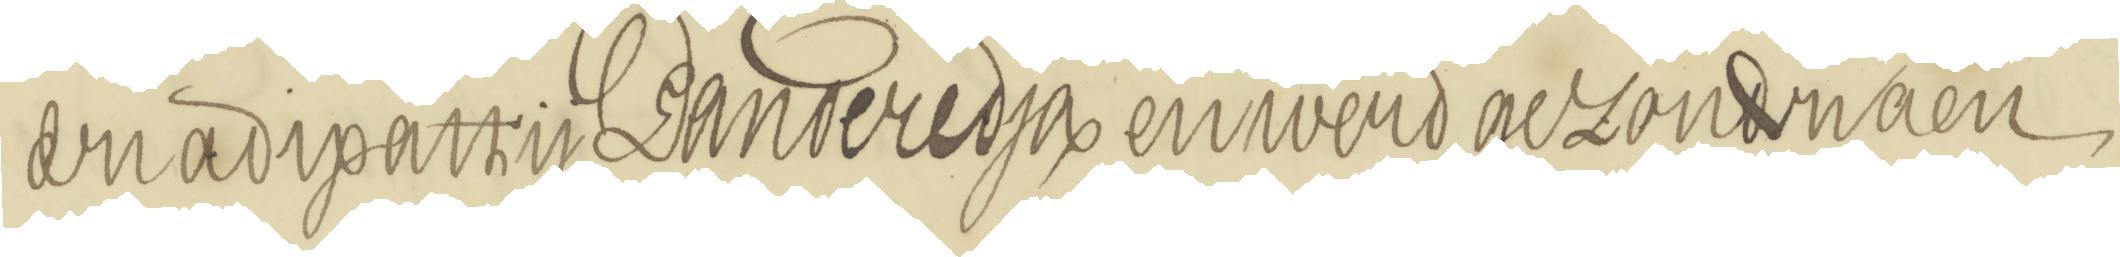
den adipattij Danoeredja en werd gezonden aen
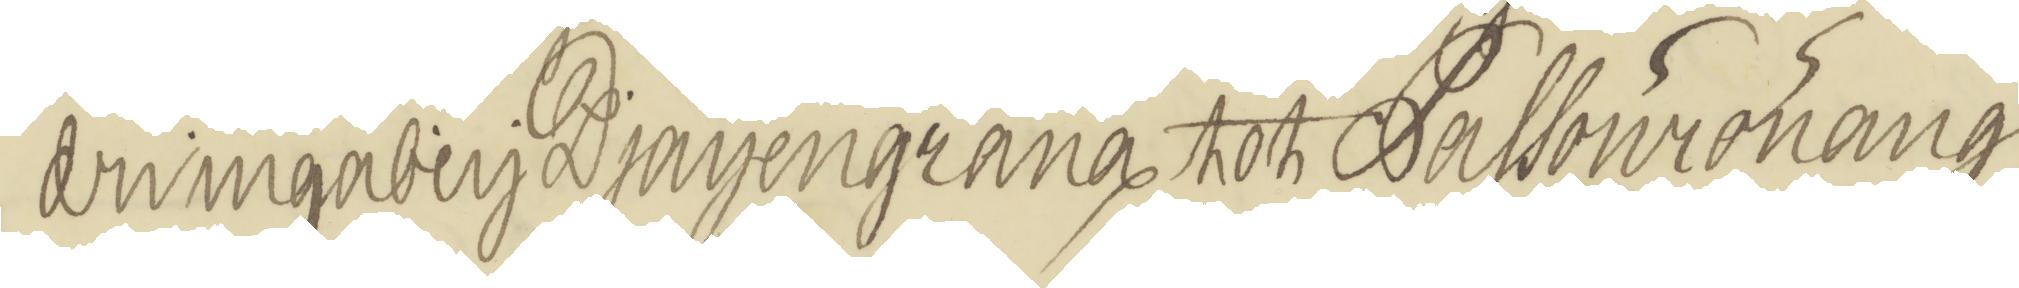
den ingabeij Djaijengrana tot Passourouang
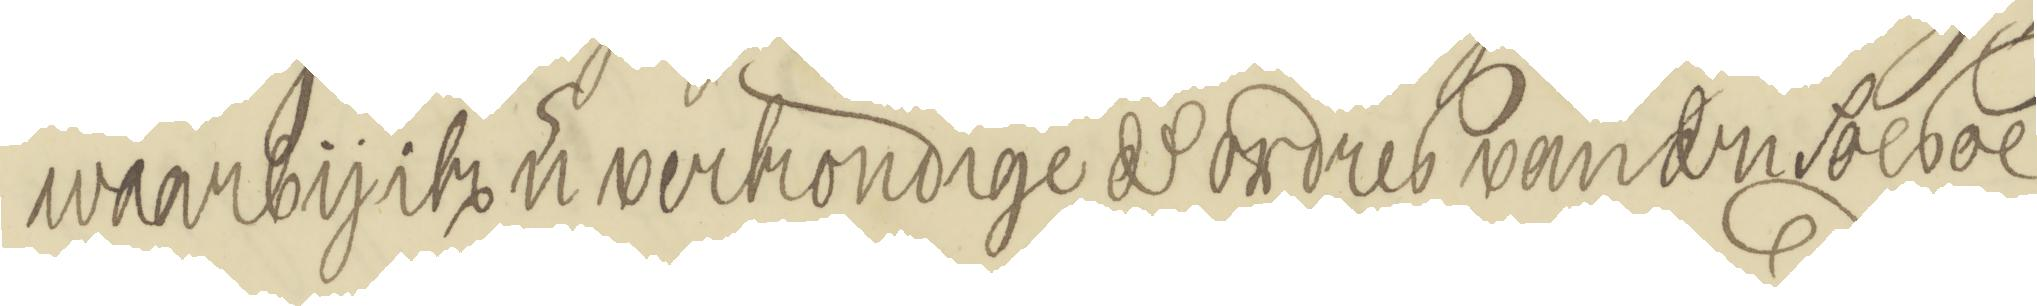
waarbij ik u verkondige de ordres van den soesoe
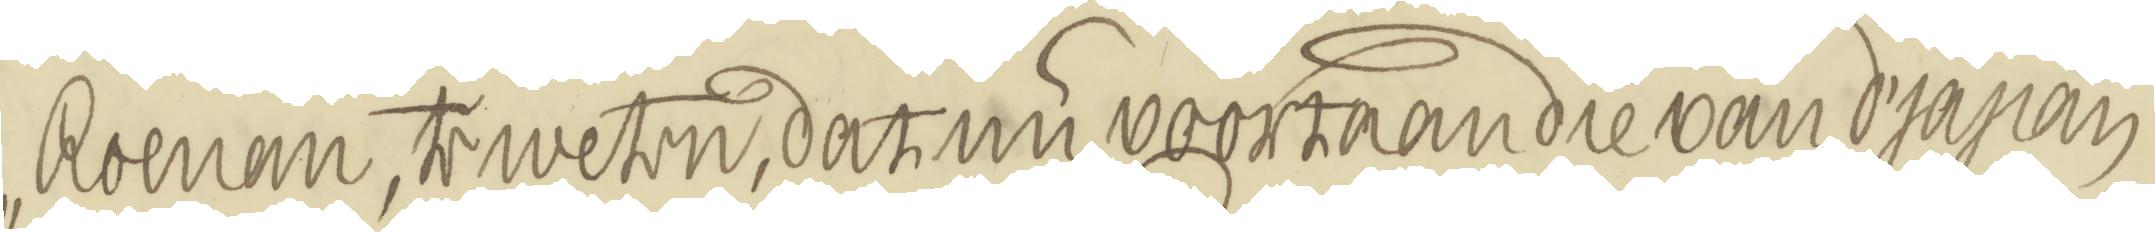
hoenan, te weten, dat nu voortaan die van d'japan
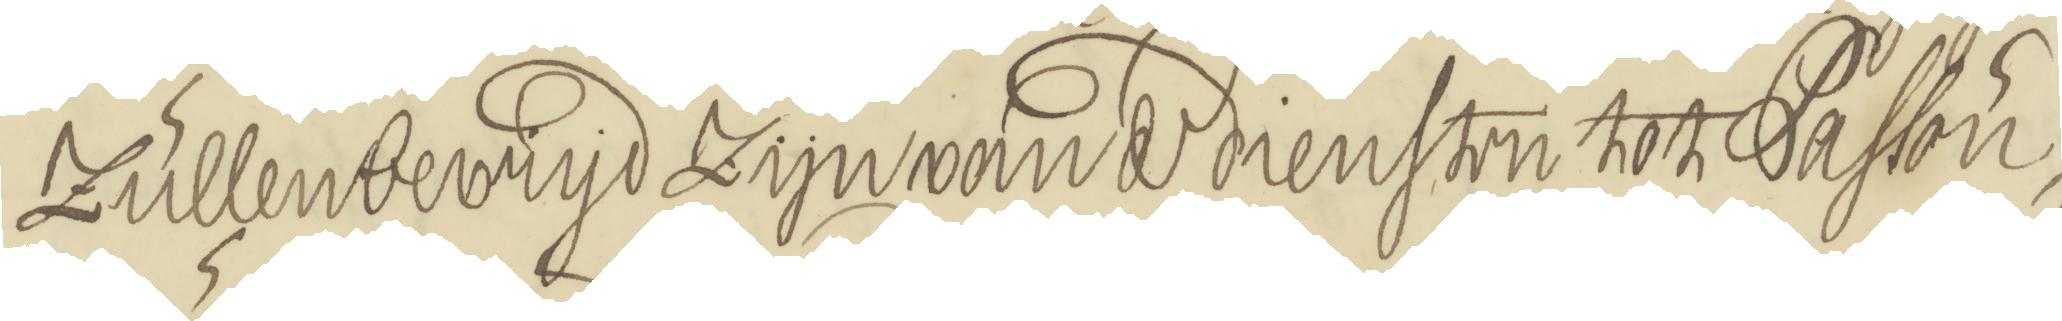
zullen bevrijd zijn van de diensten tot Passou
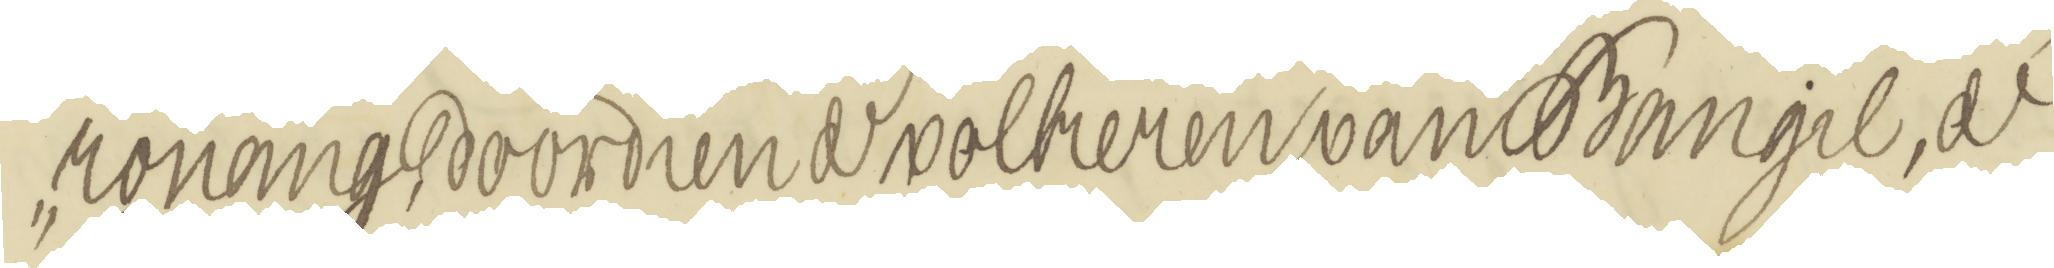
„rouang, door dien de volkeren van Bangil, de
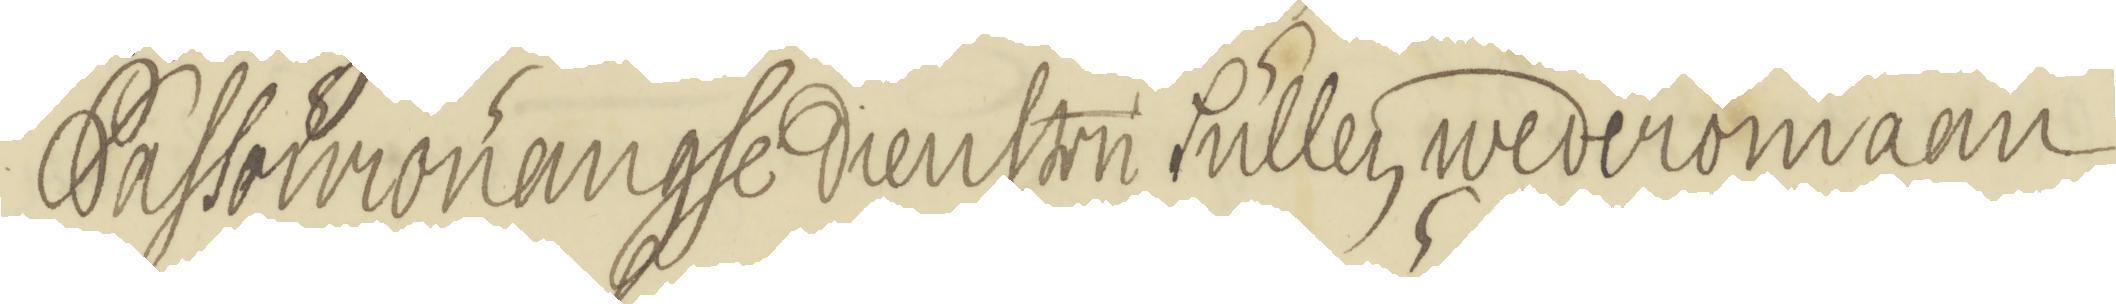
Passourouangse diensten sullen wederom aan
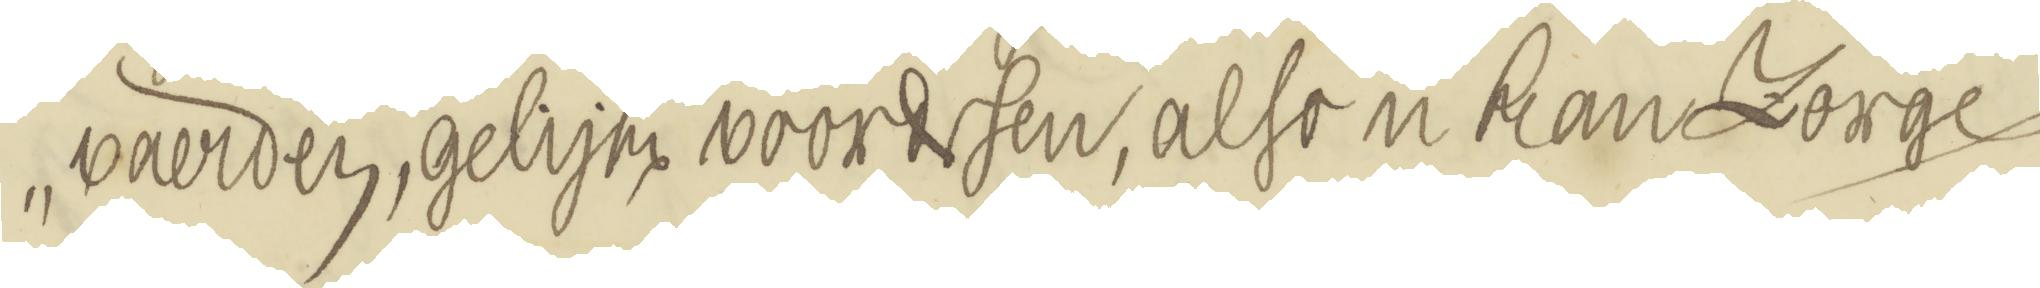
„vaerden, gelijk voor desen, also u kan zorge
